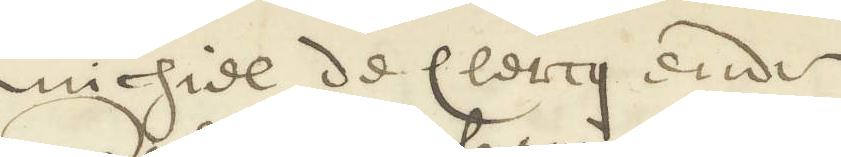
michiel de Clercq ende
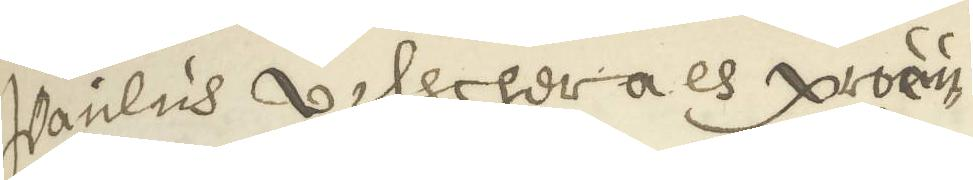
Paulus Visscher als procu
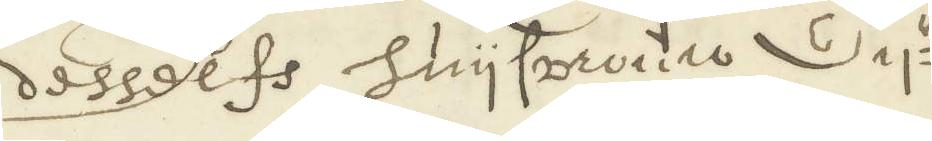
desselfs huijsvrouw Ey=r
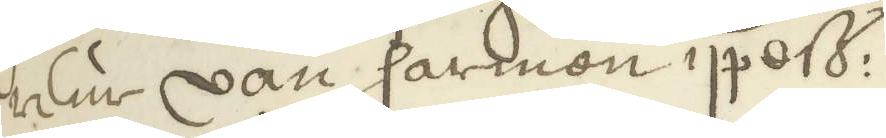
reur van harmen ypers:
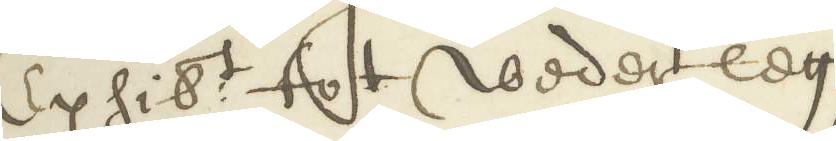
Exhib:t tot wederleg
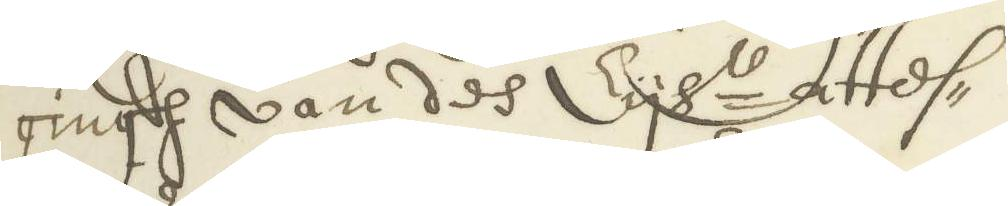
gingh van des Eijs=rs attes„
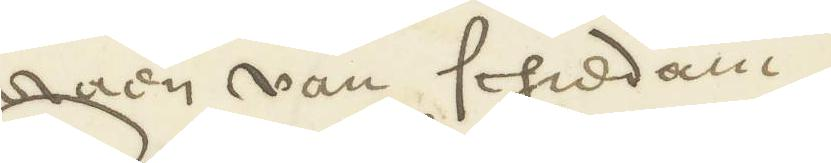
Maey van schiedam
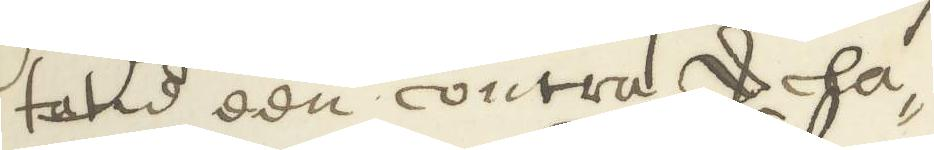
tatie een contra vercla„
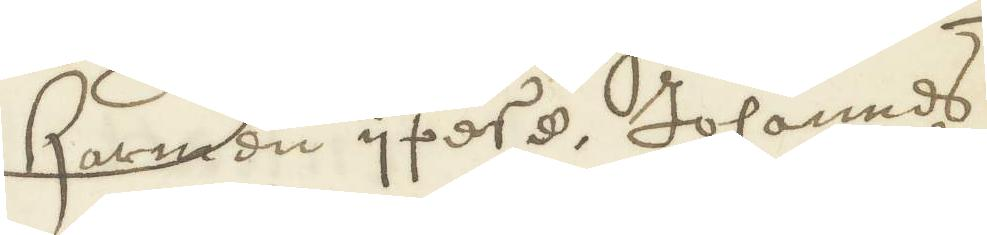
Harmen ijperse, Iohannes
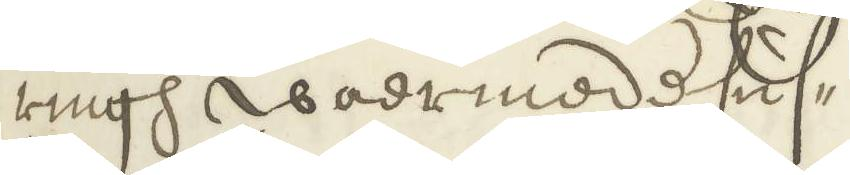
ringh waermede sus„
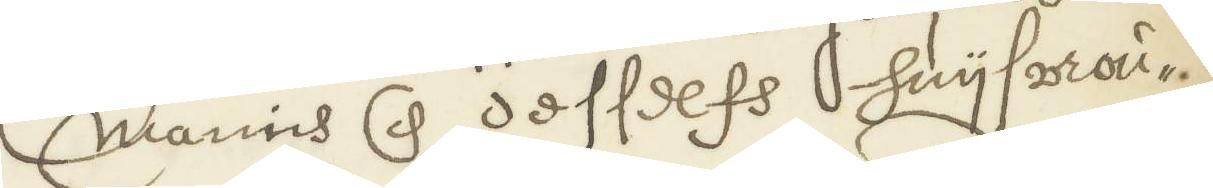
manus ende desselfs huijsvrou„
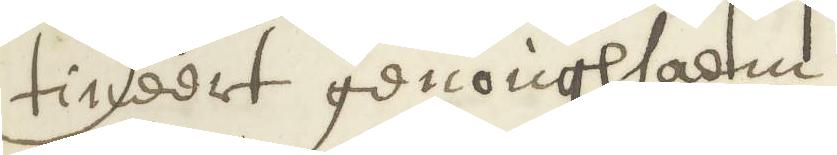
tiveert genoughsaem
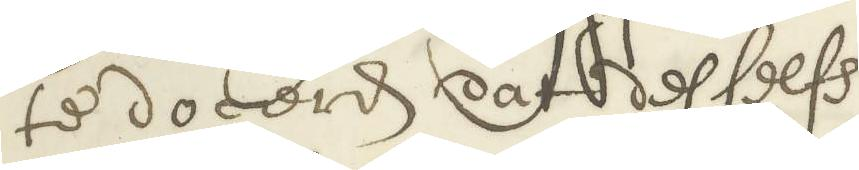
te doceren dat desselfs
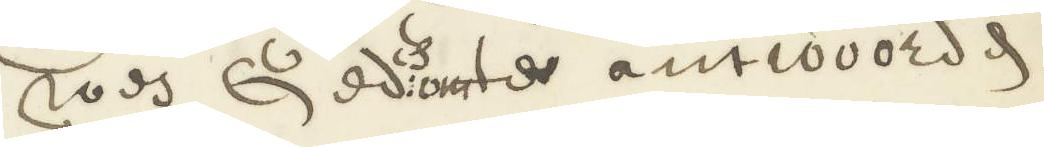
wes Ged:en om te antwoorden
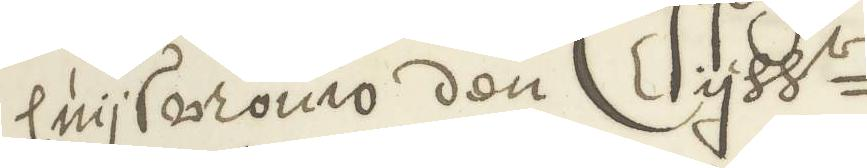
huijsvrouw den Eijss=r
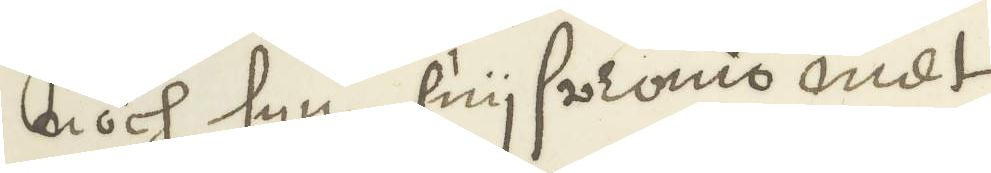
noch syn huijsvrouw niet
